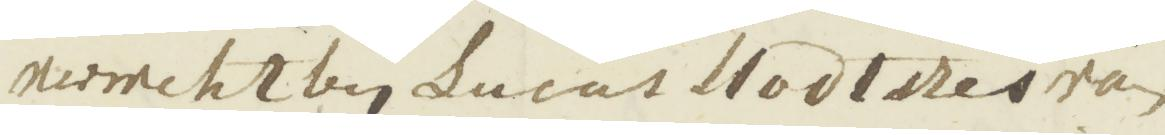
verwekt by Lucas Hodtzes van
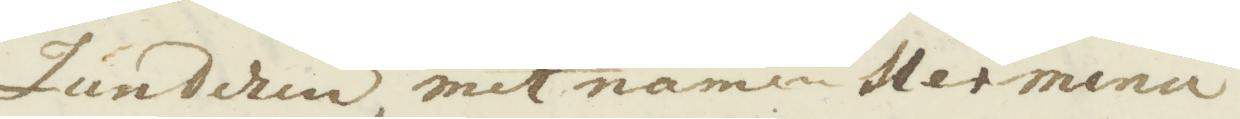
Zunderen met namen Hermina
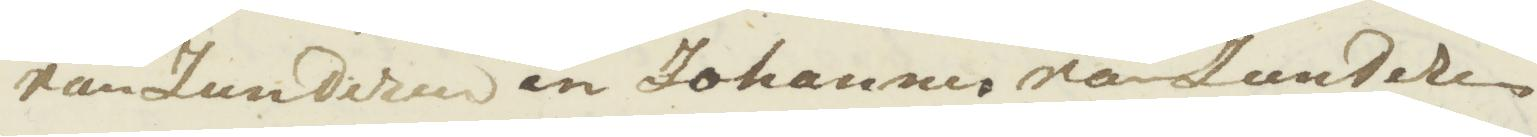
van Zunderen en Johannes van Zunderen
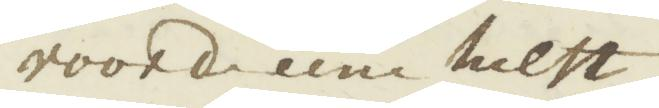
voor de eene helft,
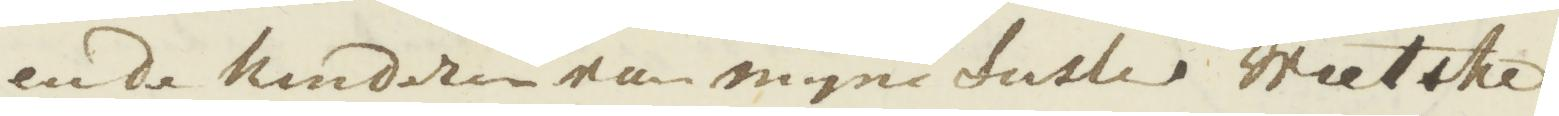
en de kinderen van myne Suster Wietske
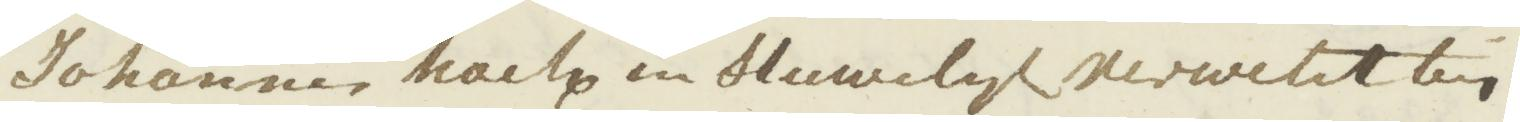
Johannes koek, in Huwelyk verwekt bij
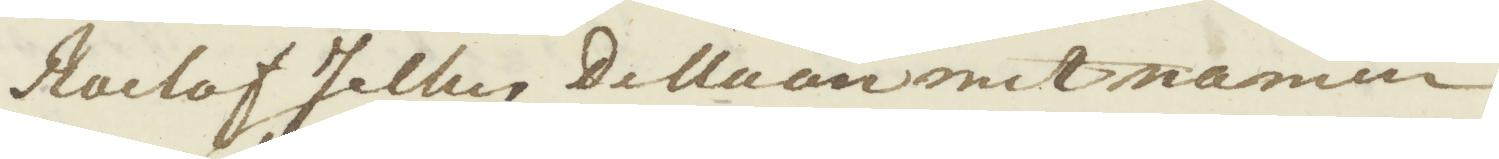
Roelof Jelkes de Haan met namen
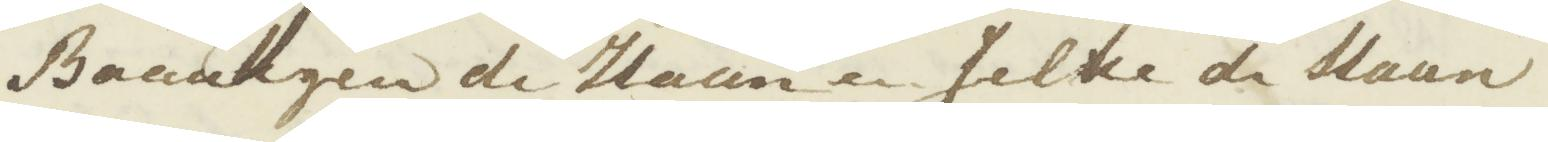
Baaukjen de Haan en Jelke de Haan
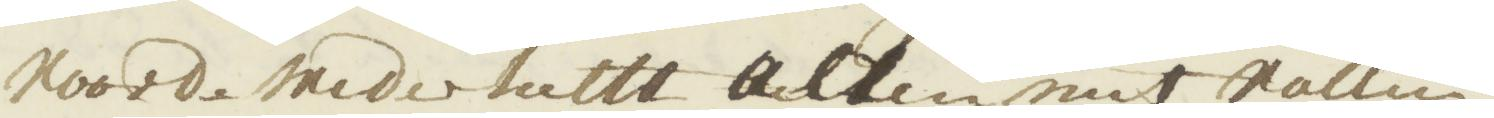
voor de wederhelft allen met vollen
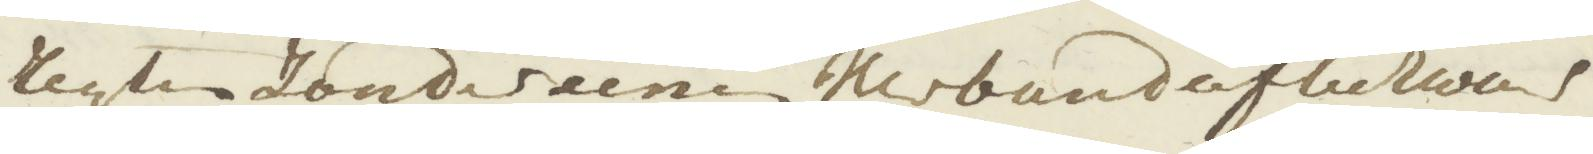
regten Zonder eenig Verband of bezwaren
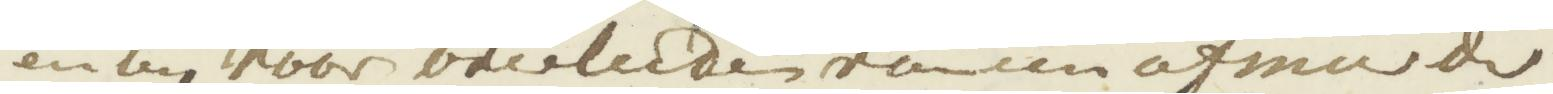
en bij Voor overleiden van een of meer der
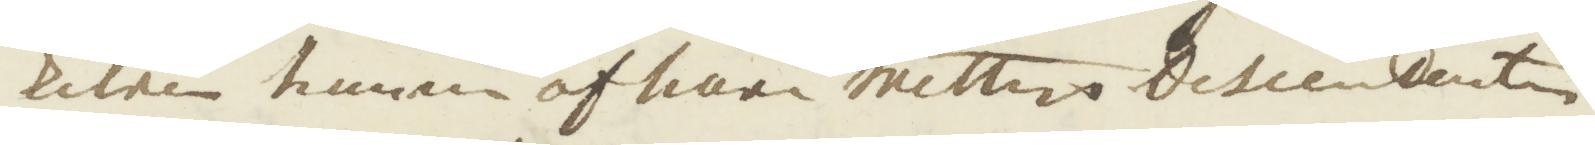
zelven hunner of harer wettige Descendenten
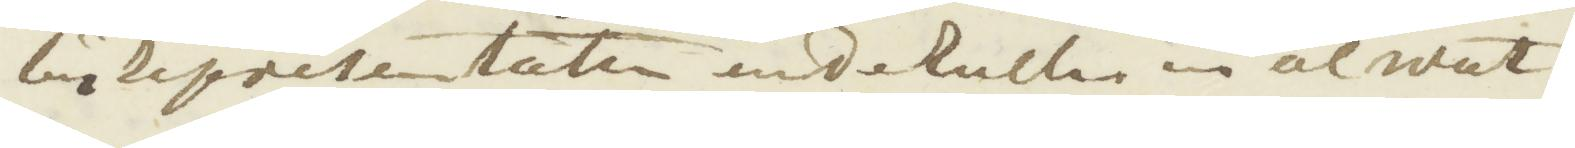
bij Representatie en de Zulks in al wat
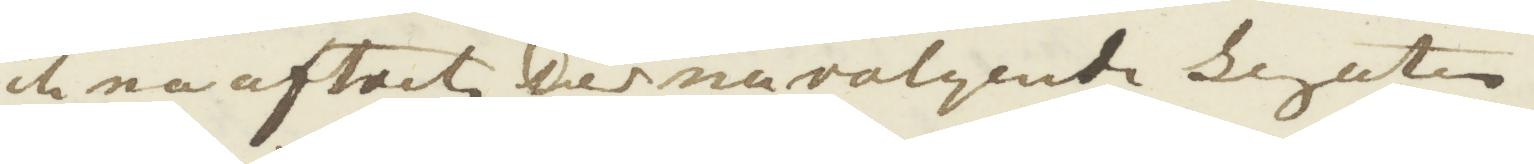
ik na aftrek der na volgende Legaten
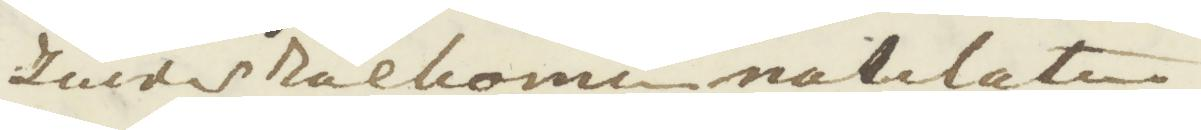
Zuiver Zal komen na te laten
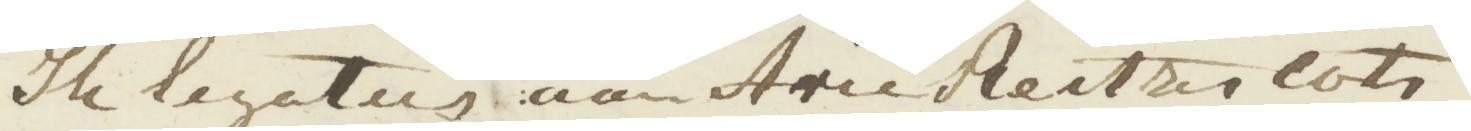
Ik legateer: aan Arie Reitzes cats
